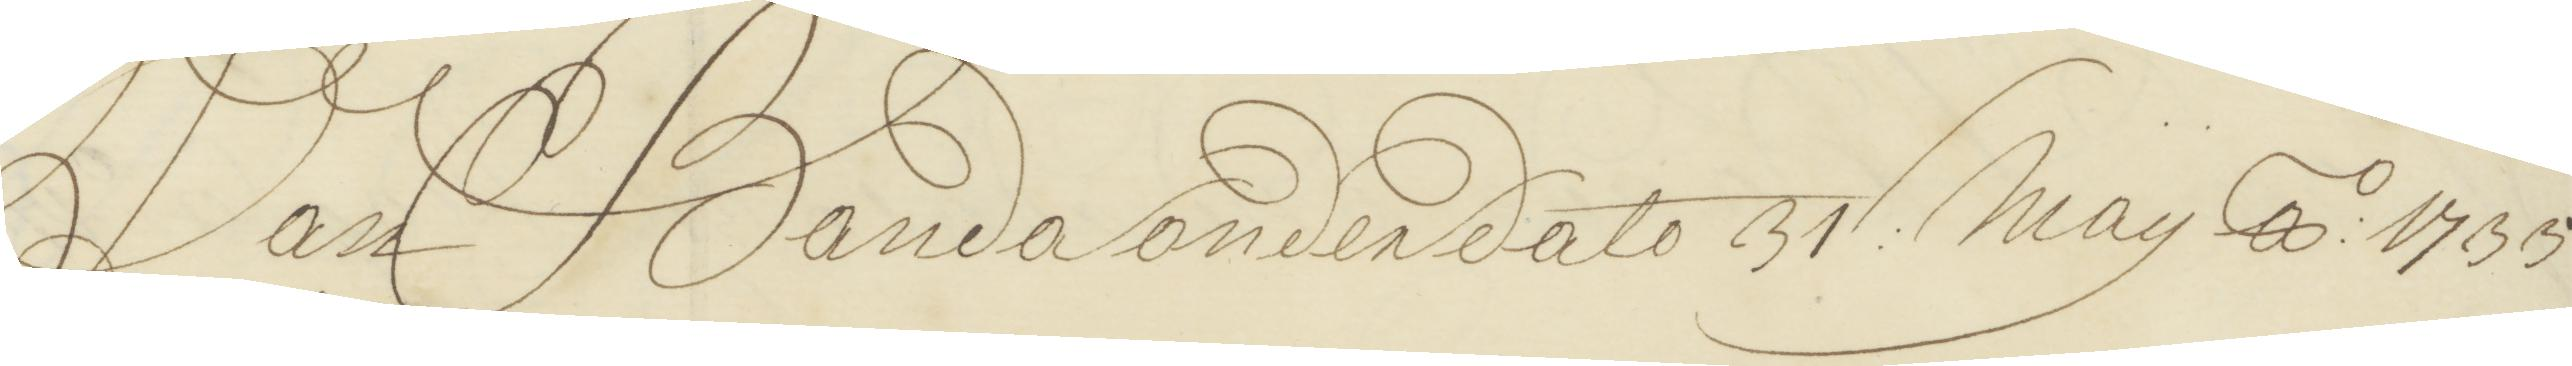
Van Banda onder dato 31:' Maij A:o 1735
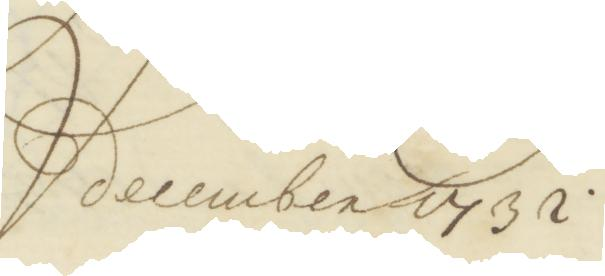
december 1732.
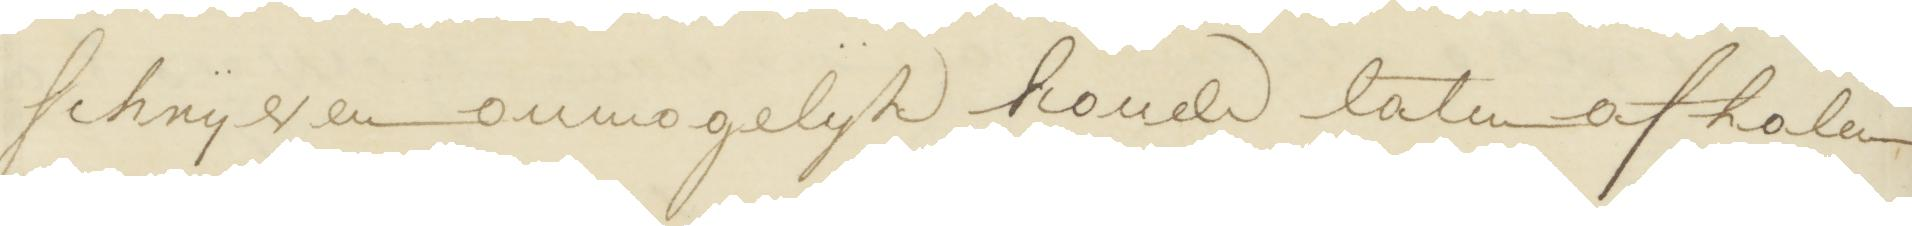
schrijven onmogeljk konde laten af halen
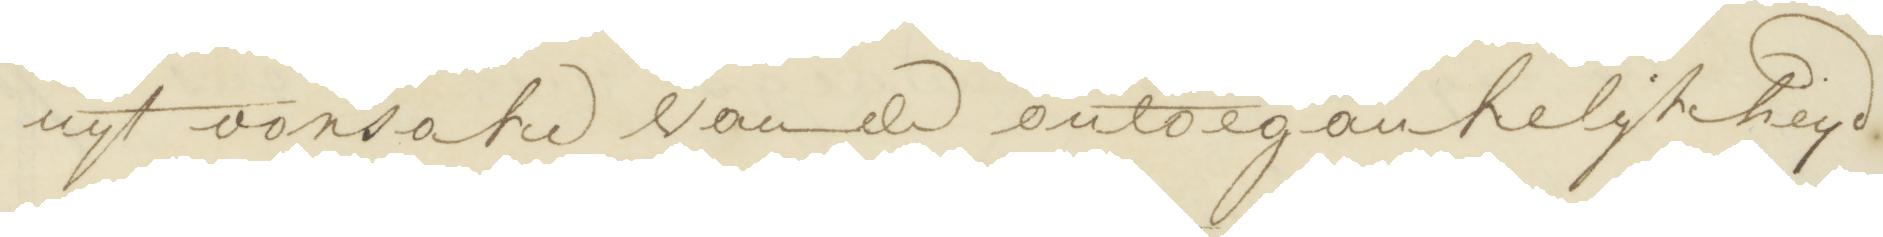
uijt oorsake van de ontoegankelijkheijd
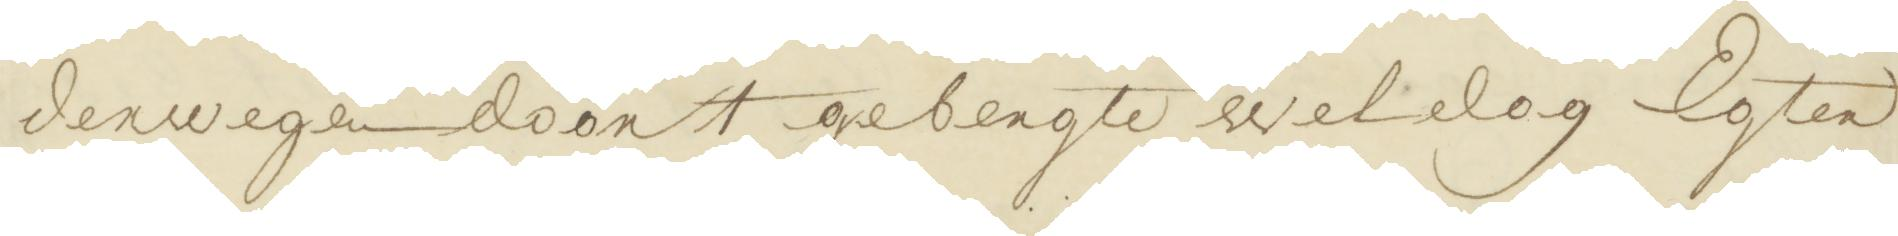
der wegen door ’t gebergte, wel dog Egter
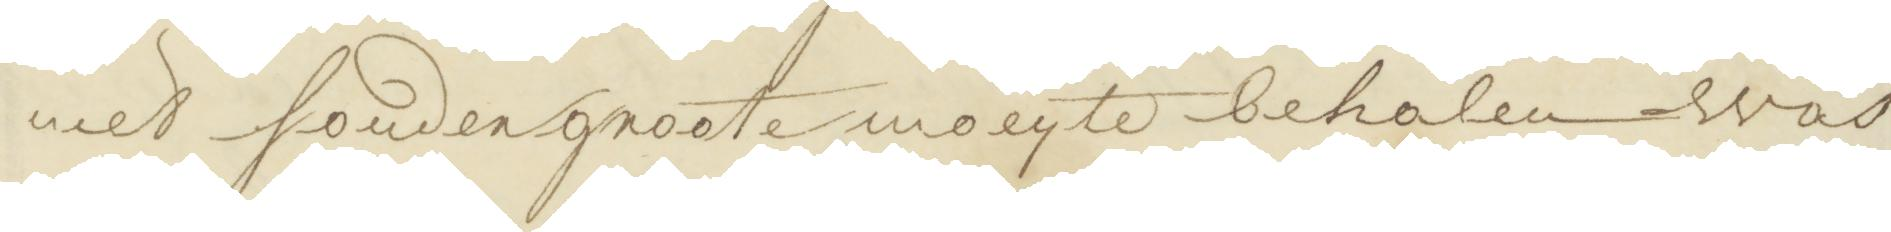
niet sonder groote moeijte behalen was,
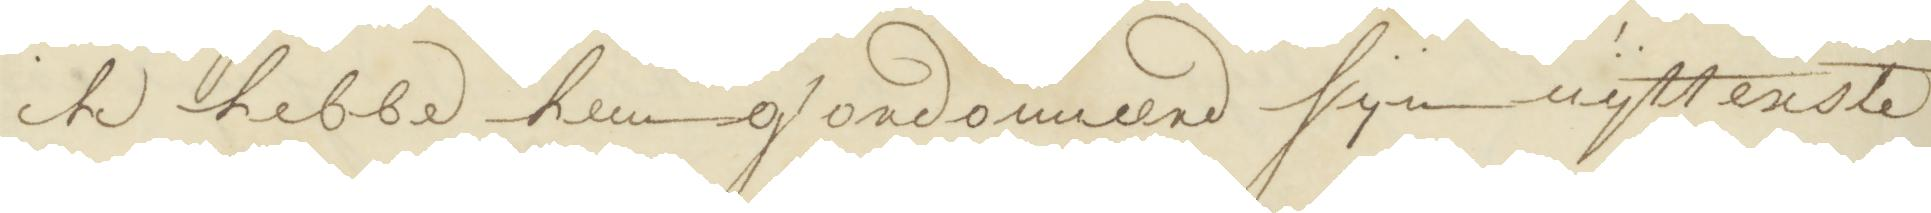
ik hebbe hem g’ordonneerd sijn uijtterste
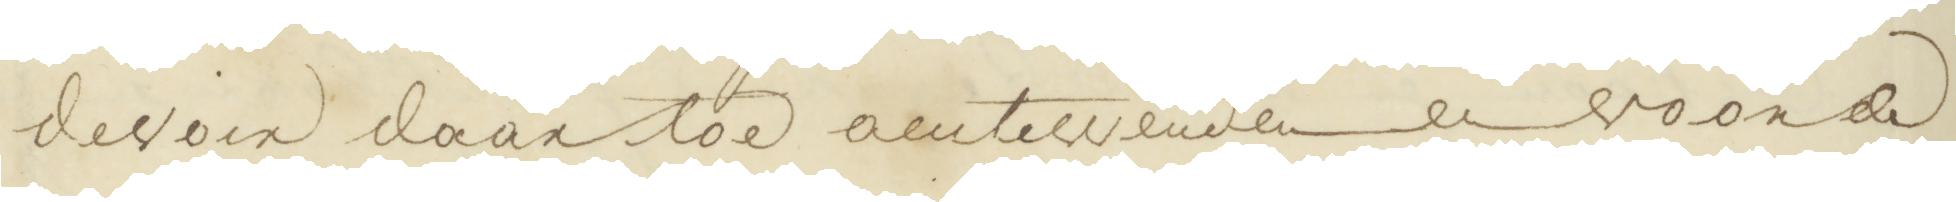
devoir daar toe aen te wenden en voor de
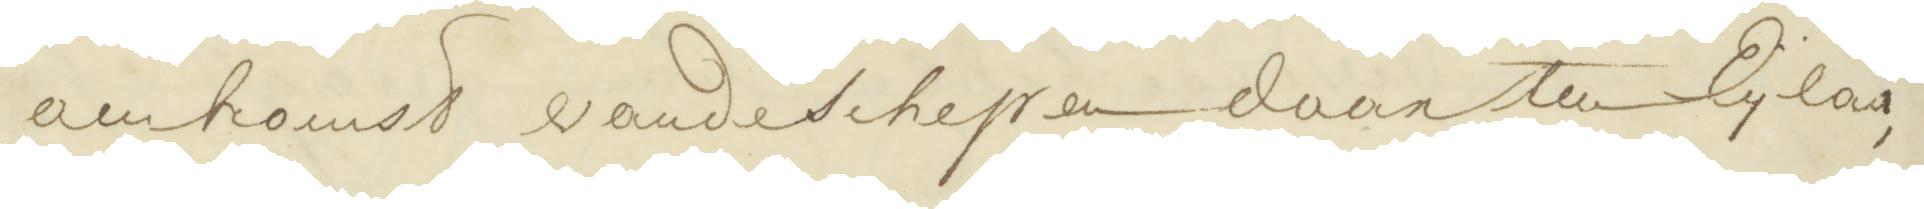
aenkomst van de schepen daar ten Eijlan„
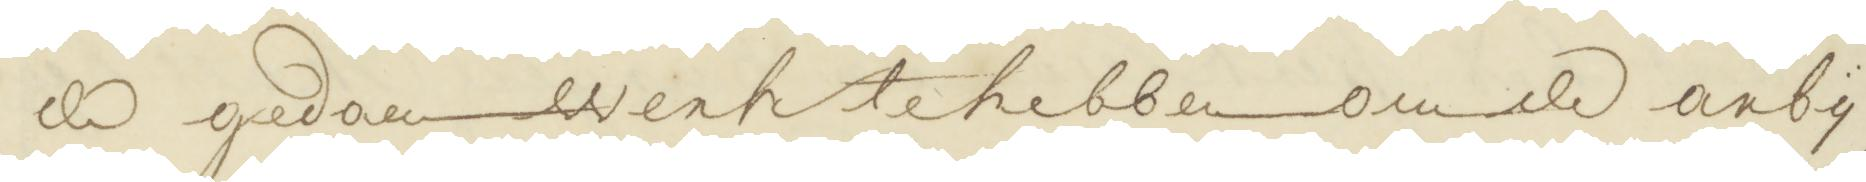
de gedaen werk te hebben om de arbij
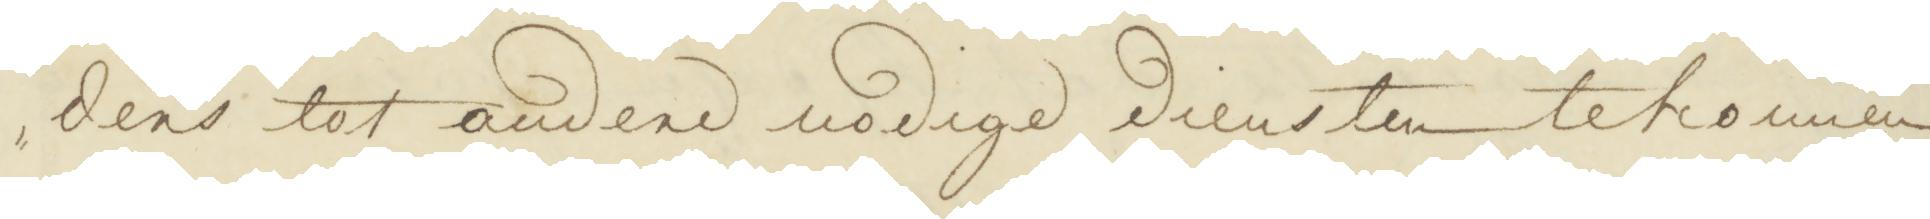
„ders tot andere nodige diensten te konnen
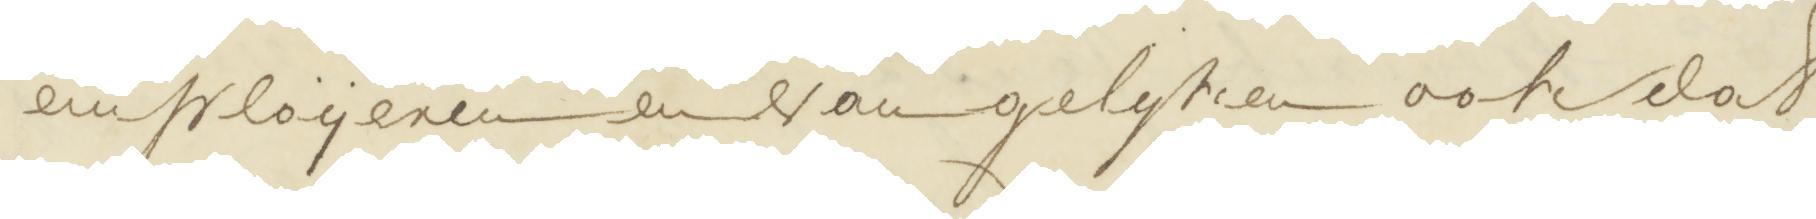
en ploijeren, en van gelijken ook dat
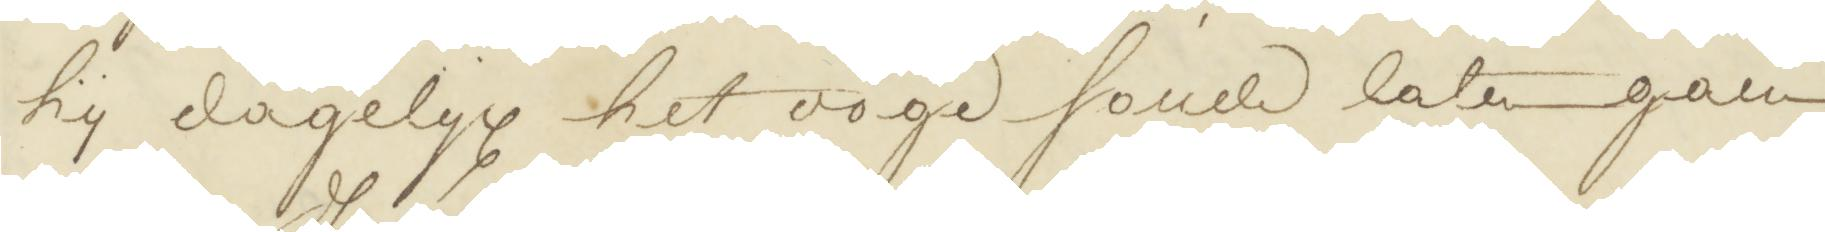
hij dagelijx het ooge soude laten gaen
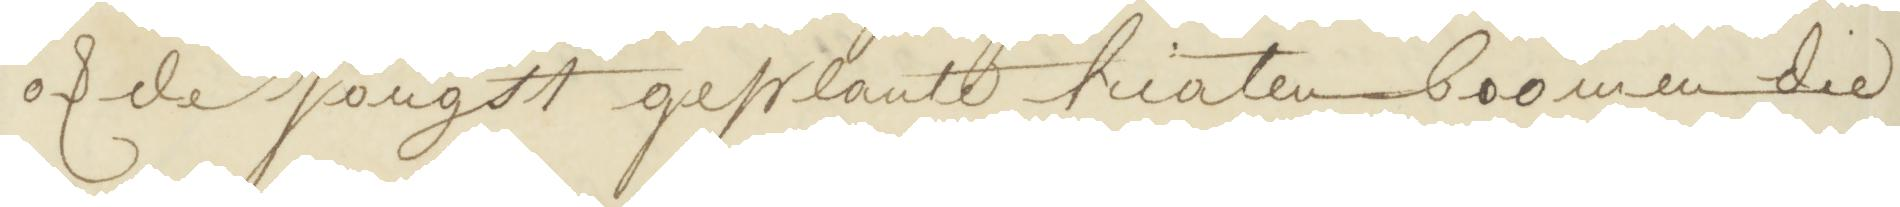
over de Jongst geplants kiaten boomen die
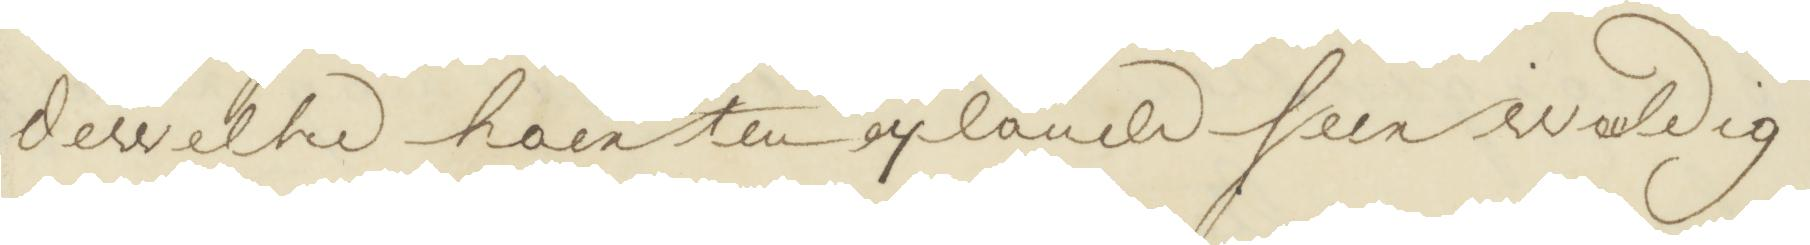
dewelke haer ten eijlande seer weelig
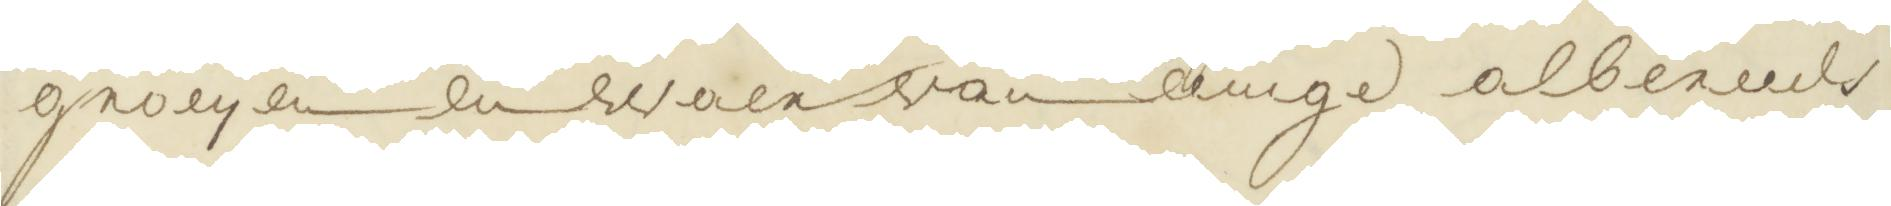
groeijen en waer van eenige al bereeds
